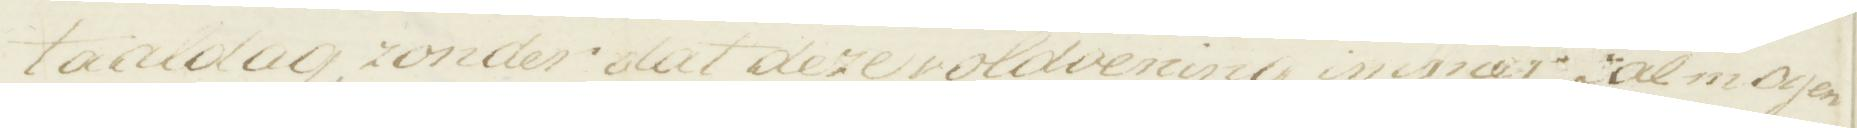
taaldag, zonder dat deze voldoening immer zal mogen
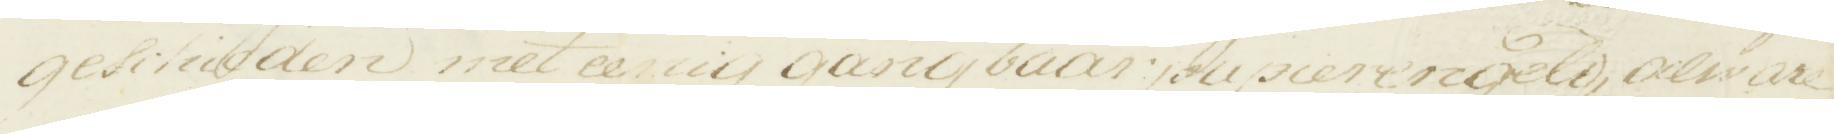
geschieden met eenig gangbaar papiergeld, alware
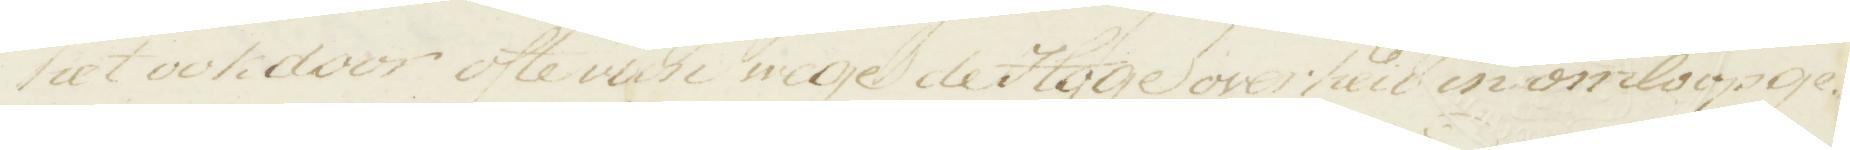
het ook door ofte van wege de Hoge overheid in omloop ge„
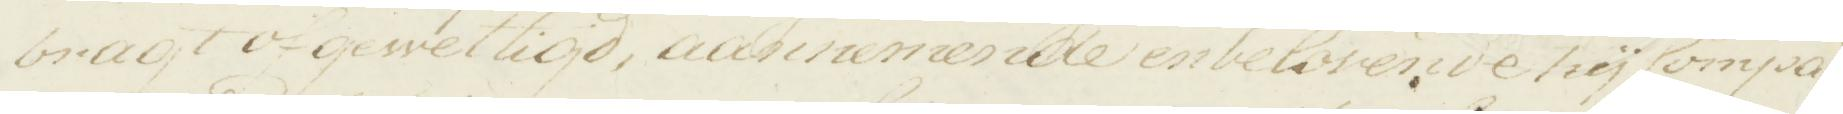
bragt of gewettigd, aannemende en belovende hij Compa
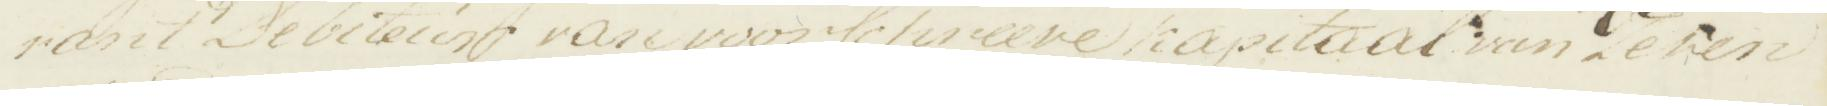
rant Debiteur van voorschreeve kapitaal van zeven
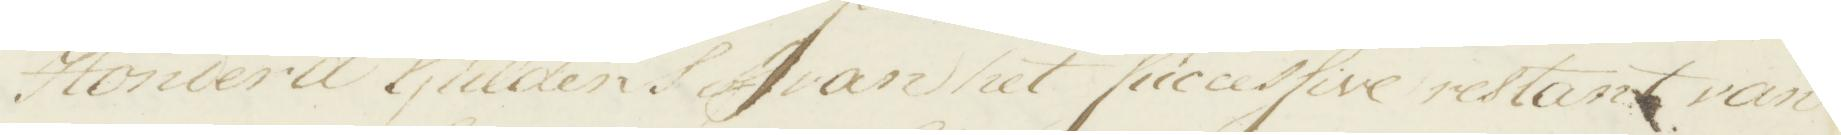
Honderd Guldens of van het successive restant van
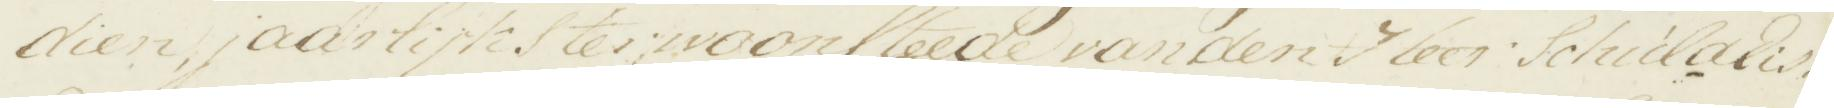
dien, jaarlijks ter woonsteede van den Heer Schuld Eis„
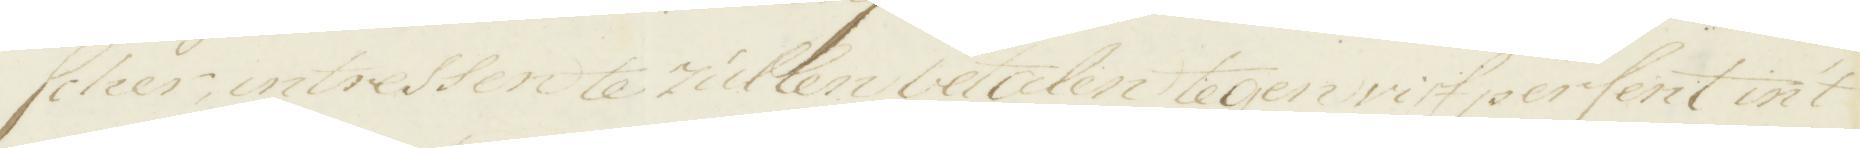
scher, intressen te zullen betalen tegen vijf percent in’t
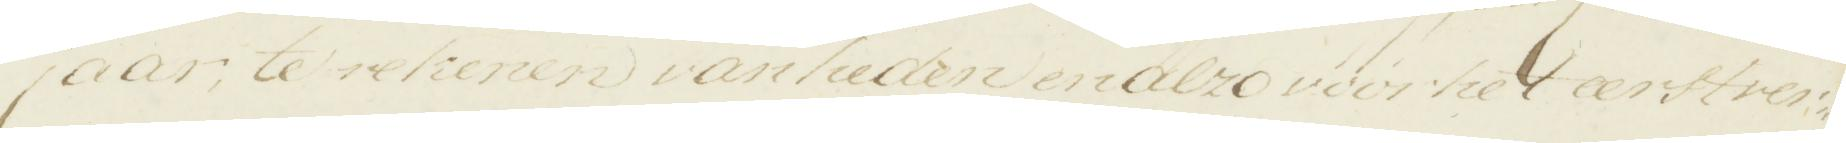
jaar, te rekenen van heden en alzo voor het eerst ver„
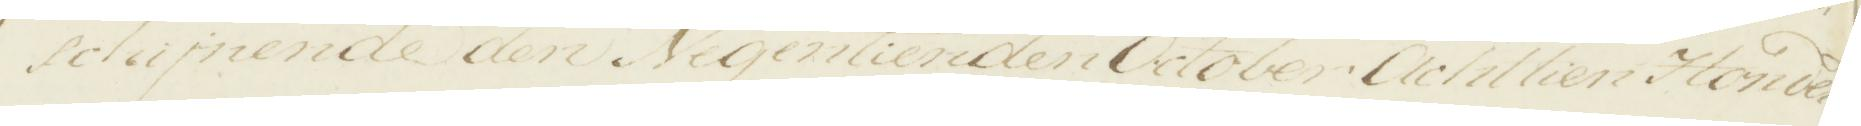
schijnende den Negentienden October Achttien Honderd
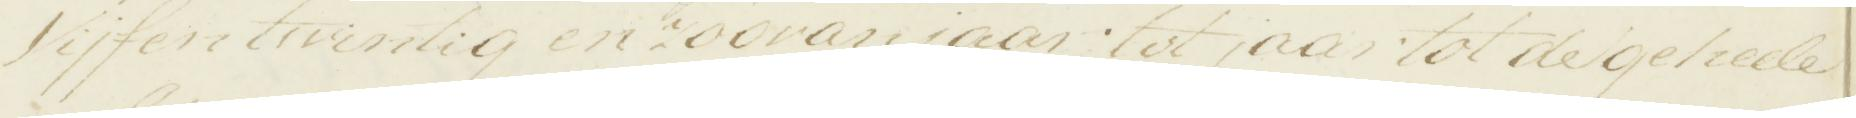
Vijf en twintig en zoo van jaar tot jaar tot de geheele
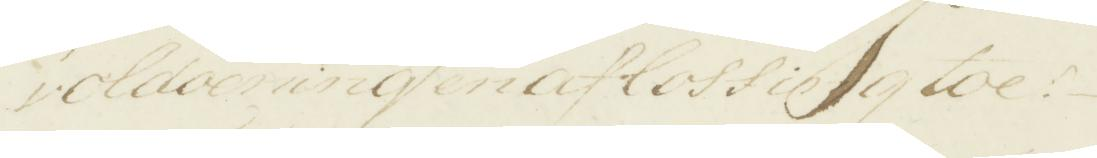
voldoening en aflossing toe:
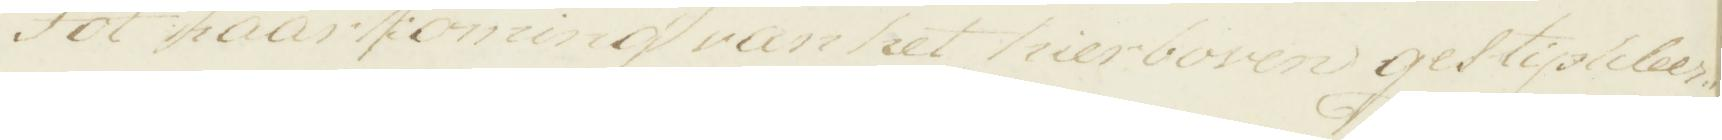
Tot naarkoming van het hierboven gestipuleer„
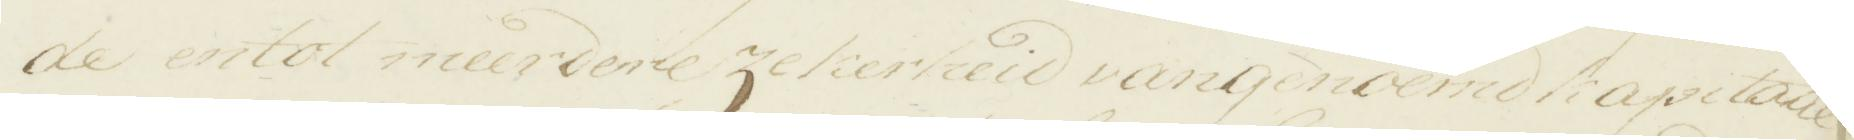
de en tot meerdere zekerheid van genoemd kapitaal
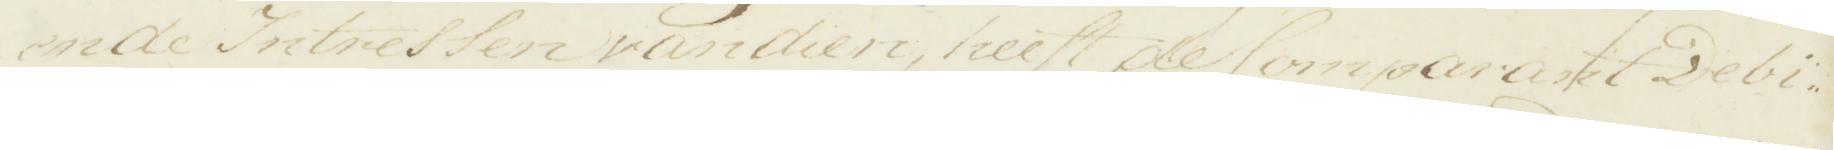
ende Jntressen van dien, heeft de Comparant Debi„
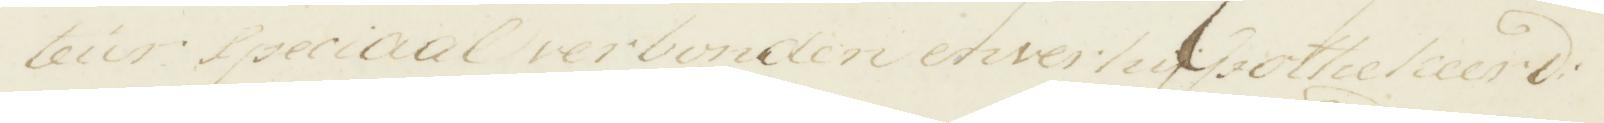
teur speciaal verbonden en verhijpothekeerd:
